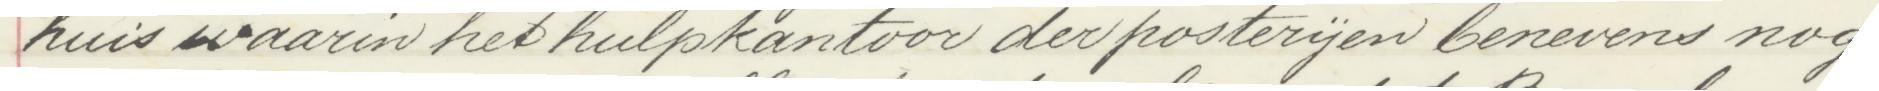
huis waarin het hulpkantoor der posterijen benevens nog
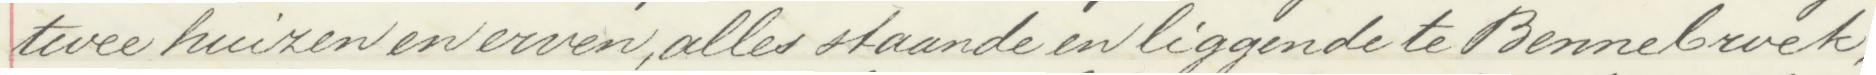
twee huizen en erven, alles staande en liggende te Bennebroek,
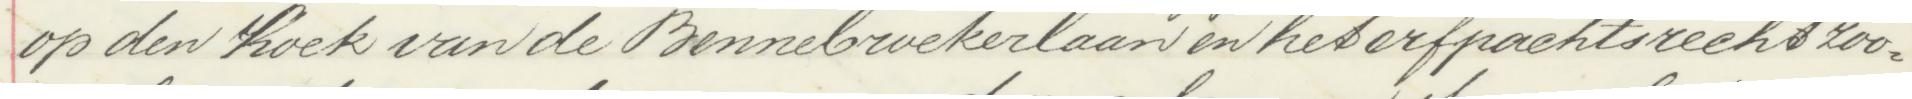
op den hoek van de Bennebroekerlaan en het erfpachtsrecht zoo=
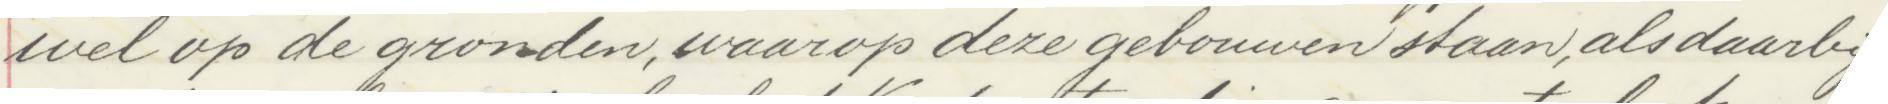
wel op de gronden, waarop deze gebouwen staan, als daarbij
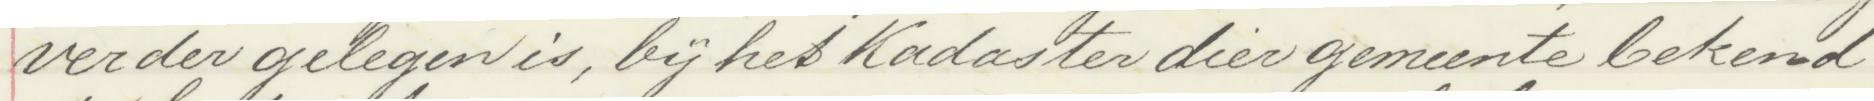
verder gelegen is, bij het Kadaster dier gemeente bekend
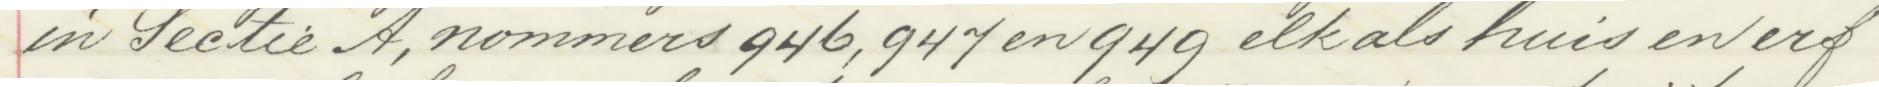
in sectie A, nommers 946, 947 en 949 elk als huis en erf
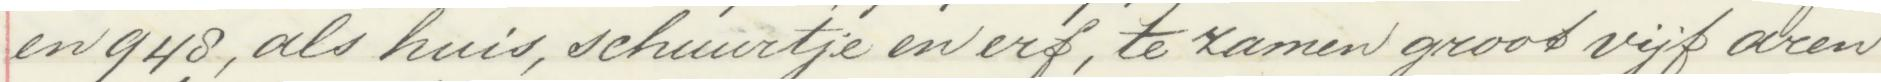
en 948, als huis, schuurtje en erf, te zamen groot vijf aren
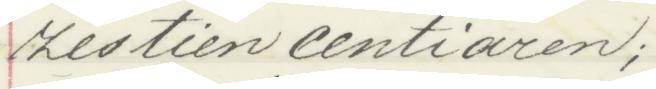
Zestien centiaren;
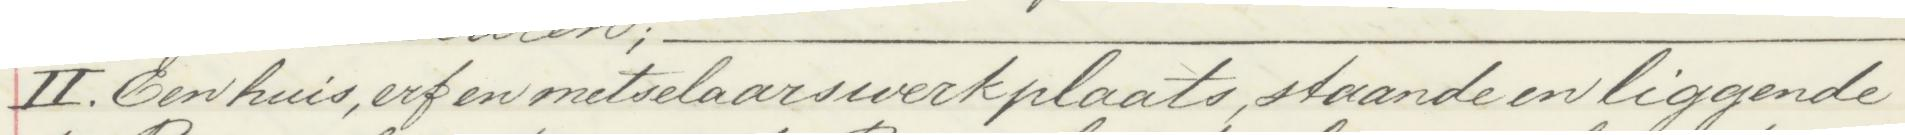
II. Een huis, erf en metselaarswerkplaats, staande en liggende
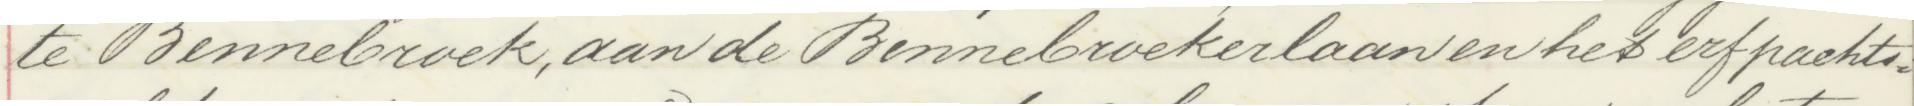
te Bennebroek, aan de Bennebroekerlaan en het erfpachts„
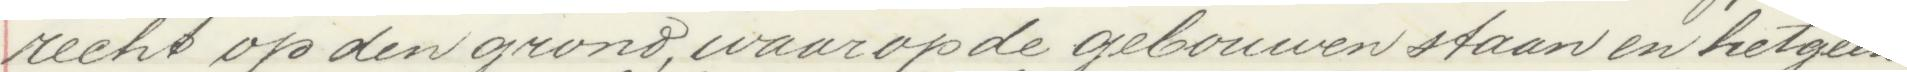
recht op den grond, waarop de gebouwen staan en hetgeen
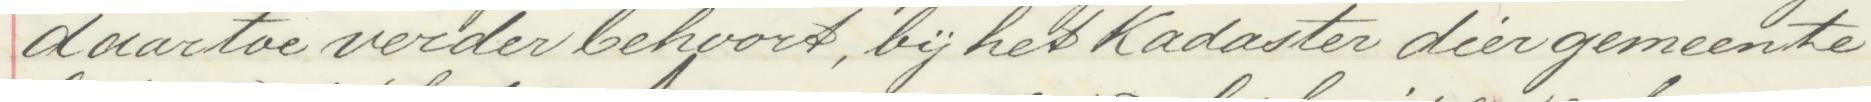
daartoe verder behoort, bij het kadaster dier gemeente
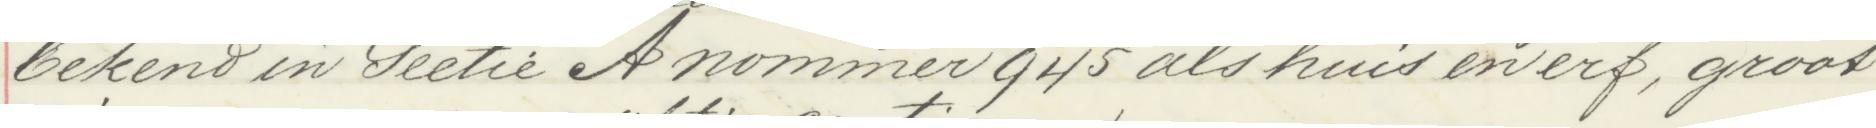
bekend in sectie A nommer 945 als huis en erf, groot
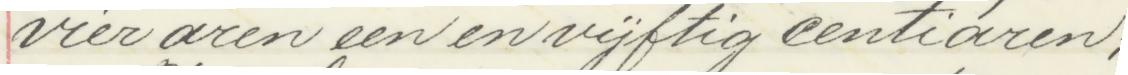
vier aren een en vijftig eentiaren:
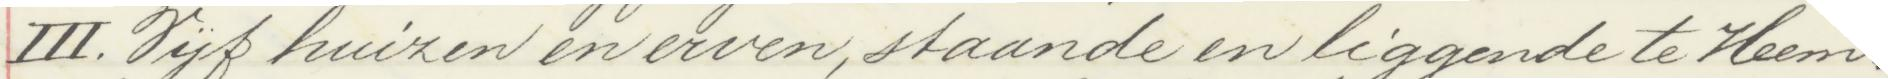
III. Vijf huizen en erven, staande en liggende te Heem„
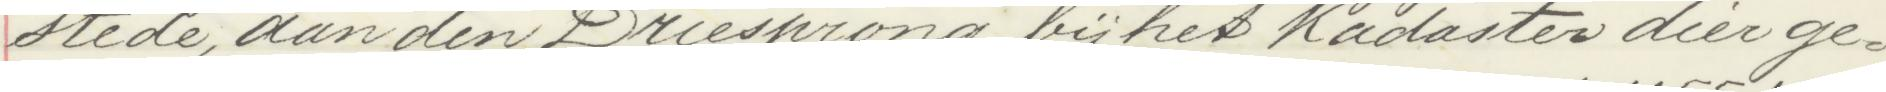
stede, aan den Driesprong, bij het Kadaster dier ge=
